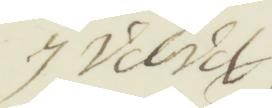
J VdVel
